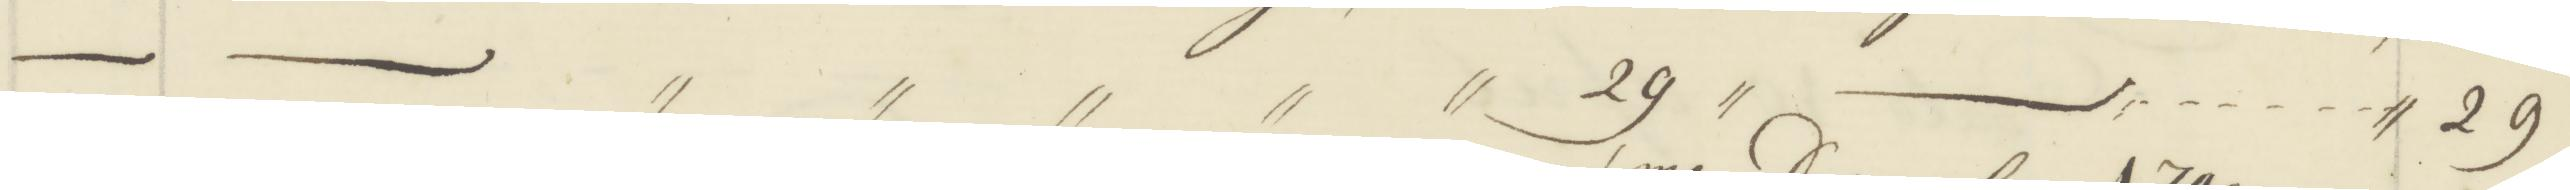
_o _d „ „ „ „ „ 29 „ _„o- - - - - - -„ 29
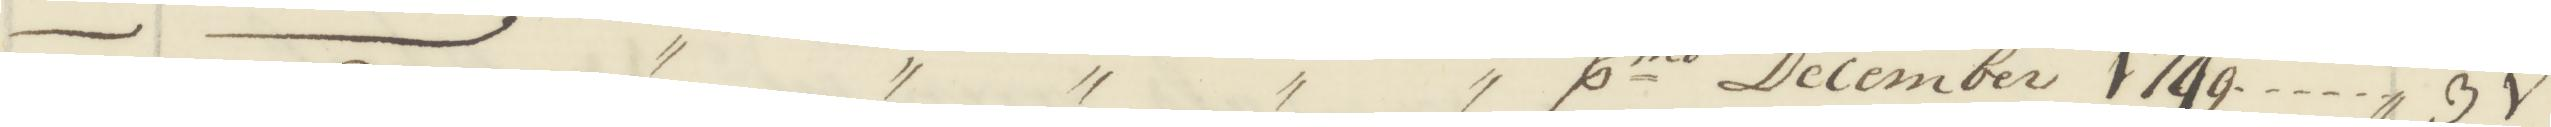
_o _o „ „ „ „ „ p=mo December 1749- - - - - -„ 31
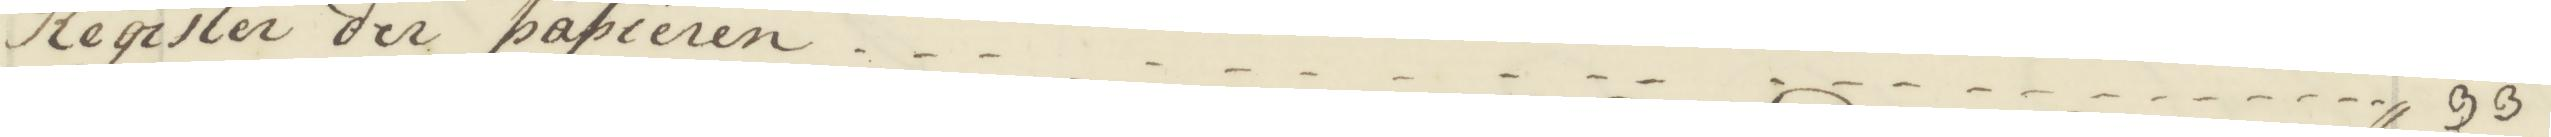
Register der papieren - - - - - - - - - - - - - - - - - - - - - -„ 33
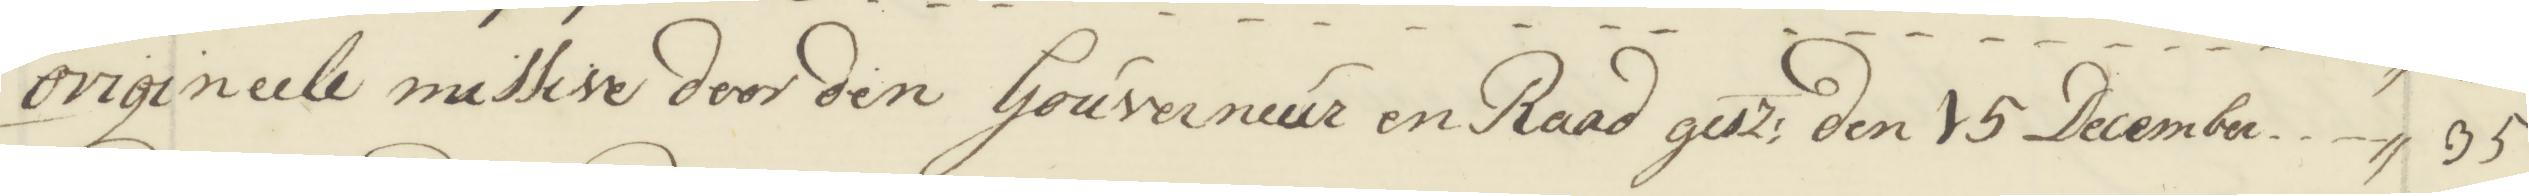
origineele missive door den Gouverneur en Raad gesz: den 15 December. - – -„ 35
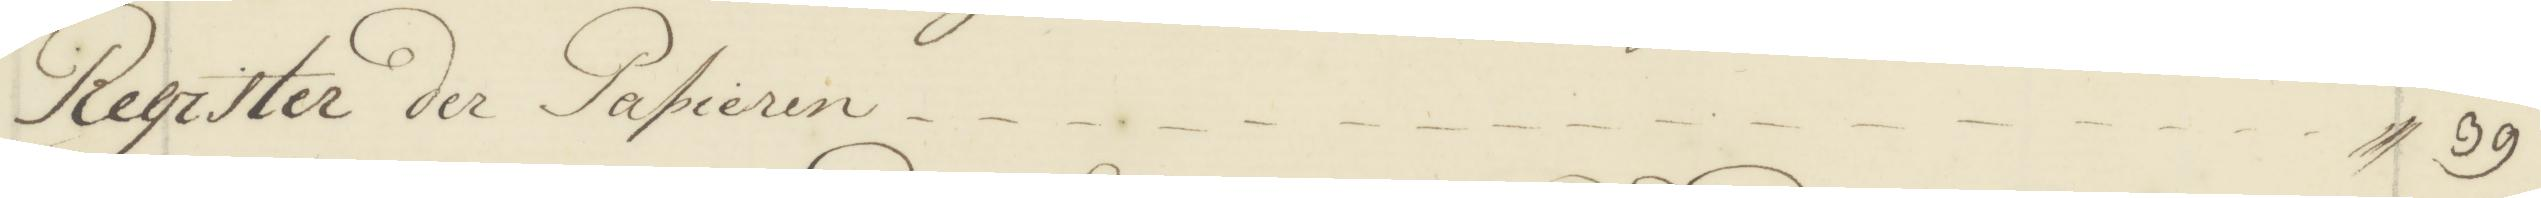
Register der Papieren – – – . – – – – – – – – – – – – – – - „ 39
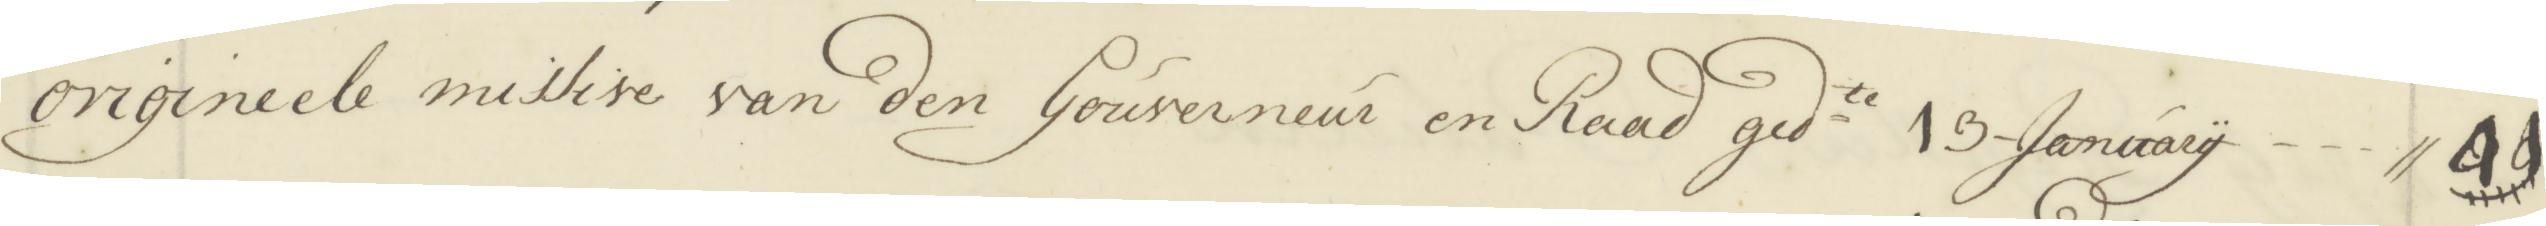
origineele missive van den Gouverneur en Raad ged=te 13–Januarij– – – - „ 44
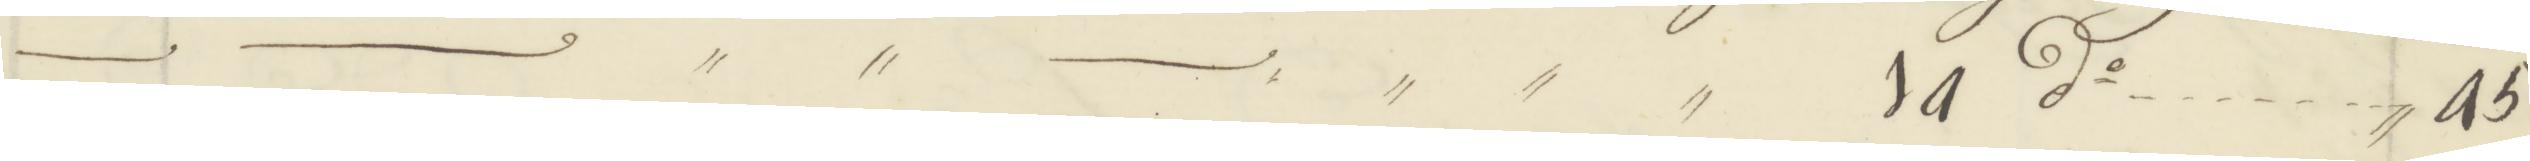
_o _o „ „ _„o „ „ „ 14 d=o – - - - - - - -„ 45
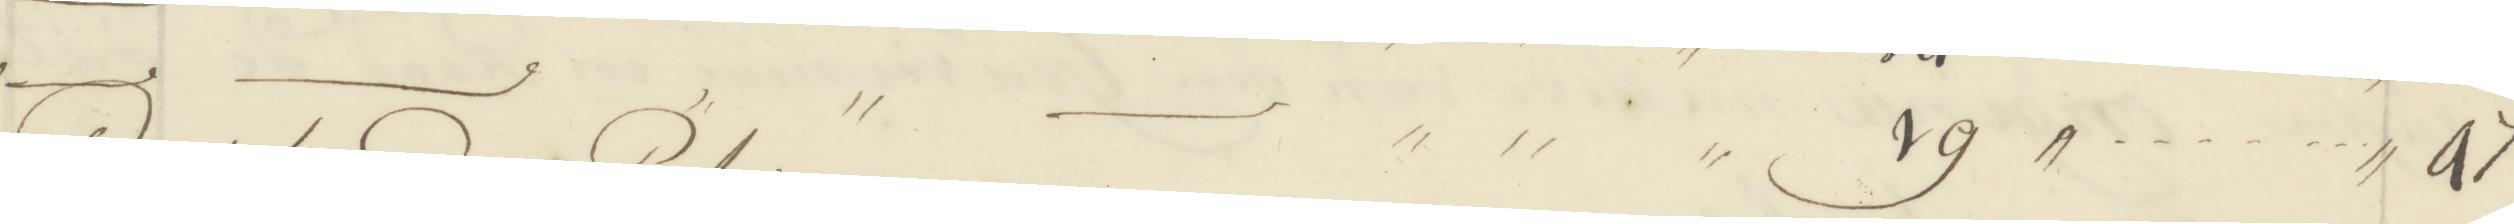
_o _o „ „ _o „ „ „ 19 „ - - - - - - . „ 47
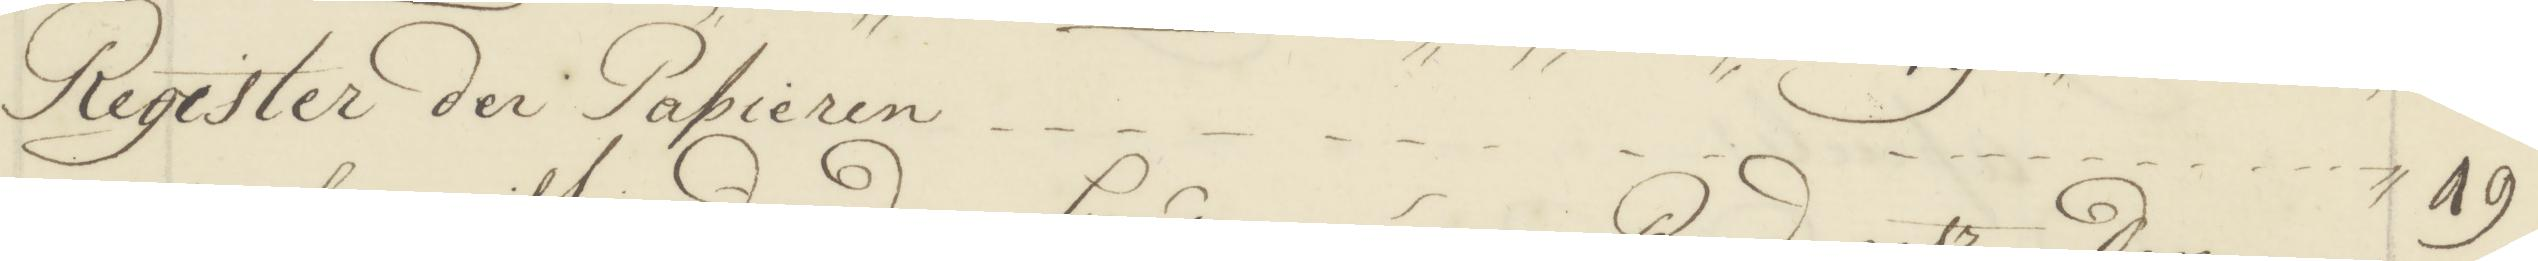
Register der Papieren - – – – – – - – – – - – – – – - - - - –„ 49
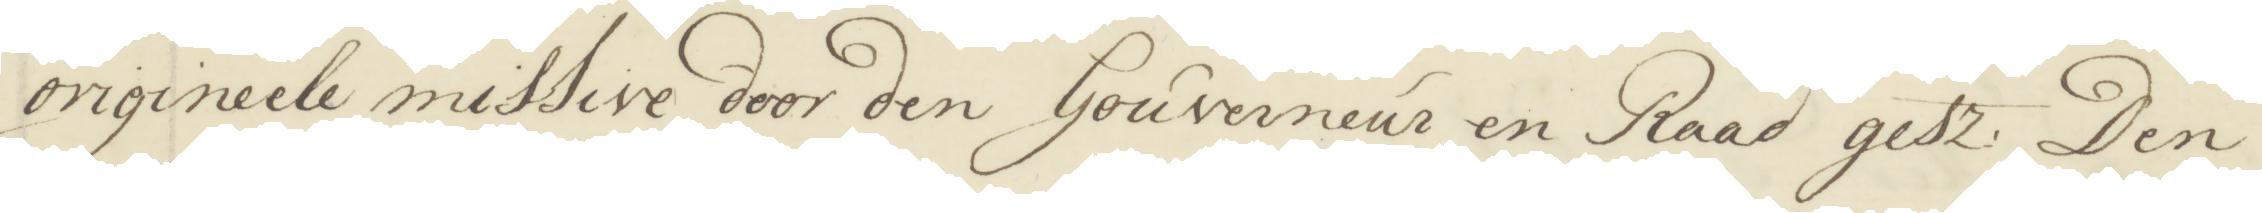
origineele missive door den Gouverneur en Raad gesz: Den
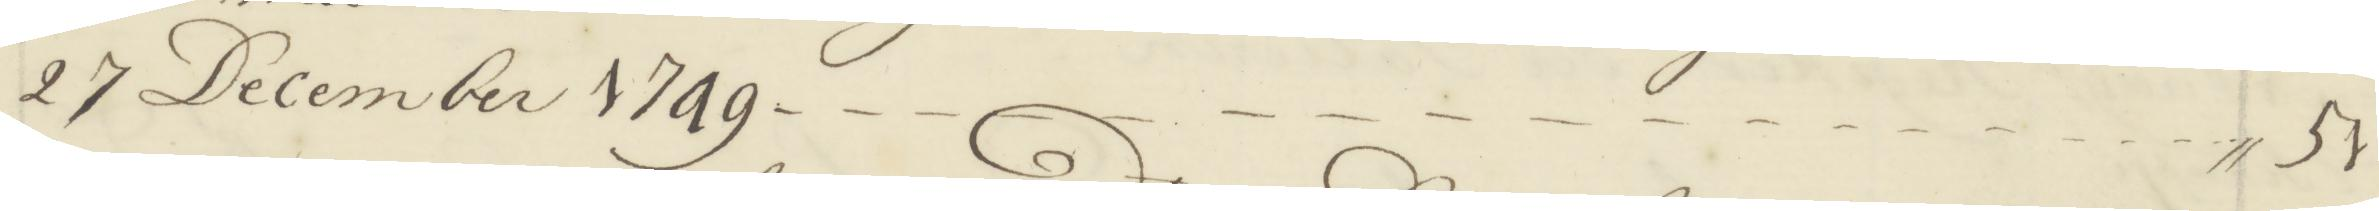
27 December 1749 – — — — — — — — — — — – – – – – – - -„ 51
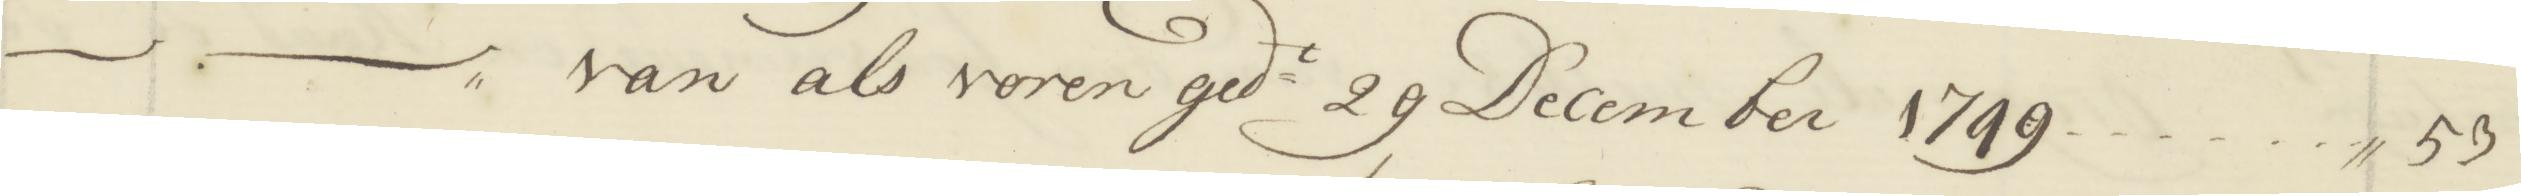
_o . _„o van als voren ged=t 29 December 1749 - - - - - - - „ 53
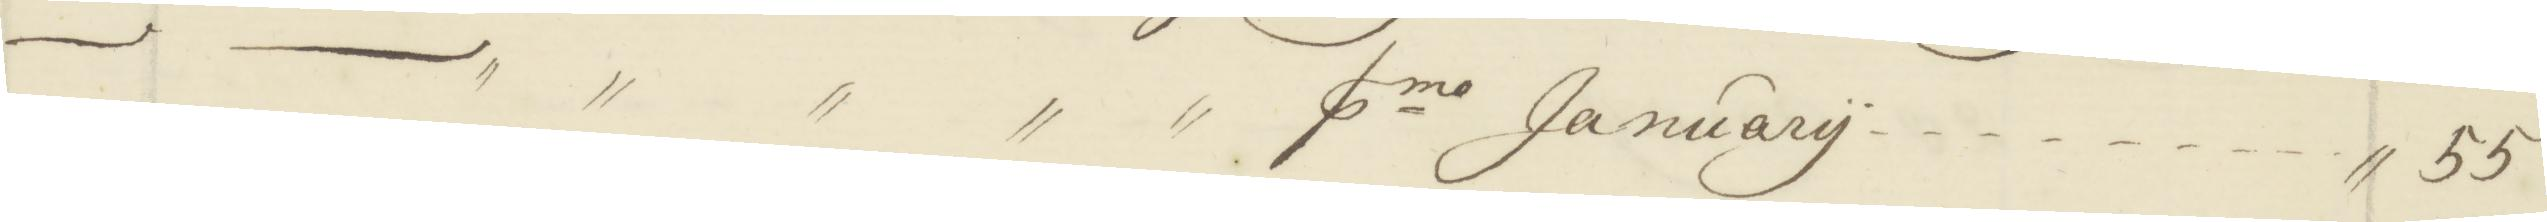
_o _„o „ „ „ „ p=mo Januarij - - - - - - - - - „ 55
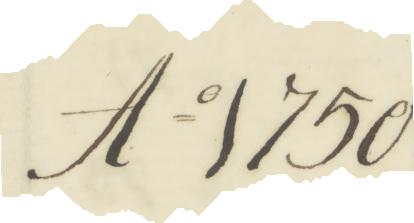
A=o 1750
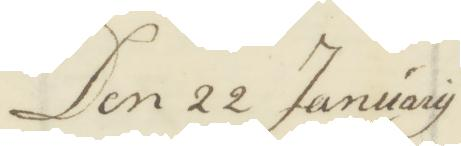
Den 22 Januarij
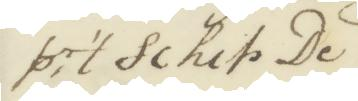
p,r ’t schip De
